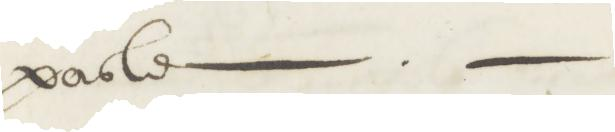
paste. —
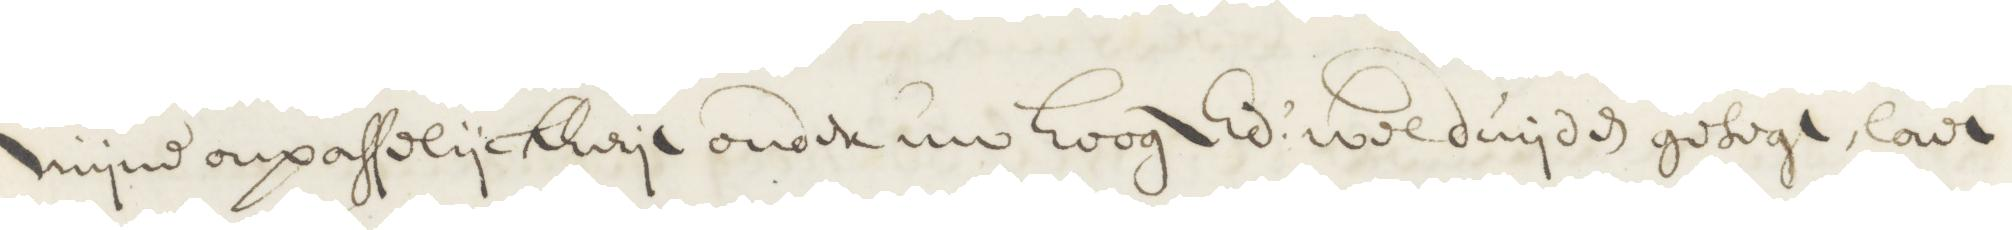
mijne onpasselijckheijt onder uw hoog Ed': wel duijden gesegt, laet
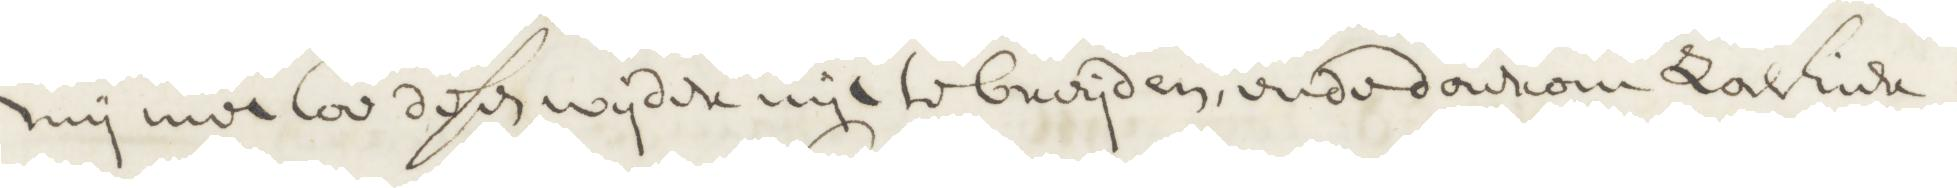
mij niet toe desen wijder uijt te breijden, ende daerom zal hier
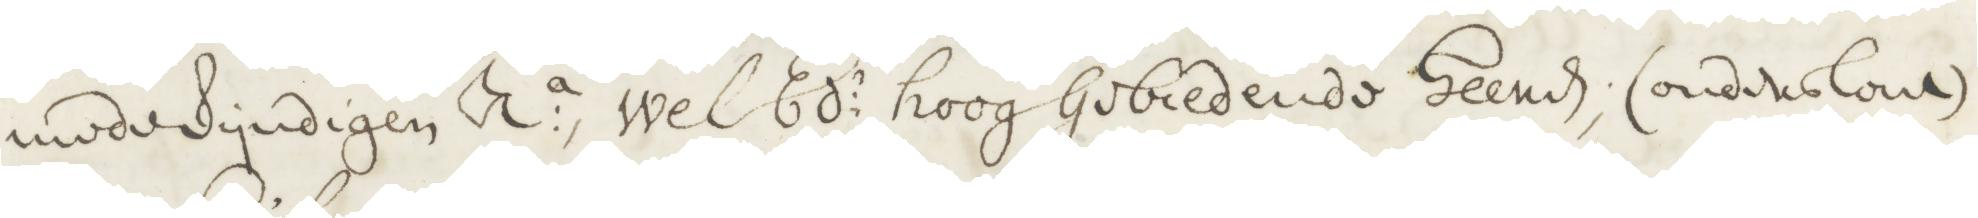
mede Eijndigen Et:a, wel Ed:' hoog gebiedende heeren; (onderstont)
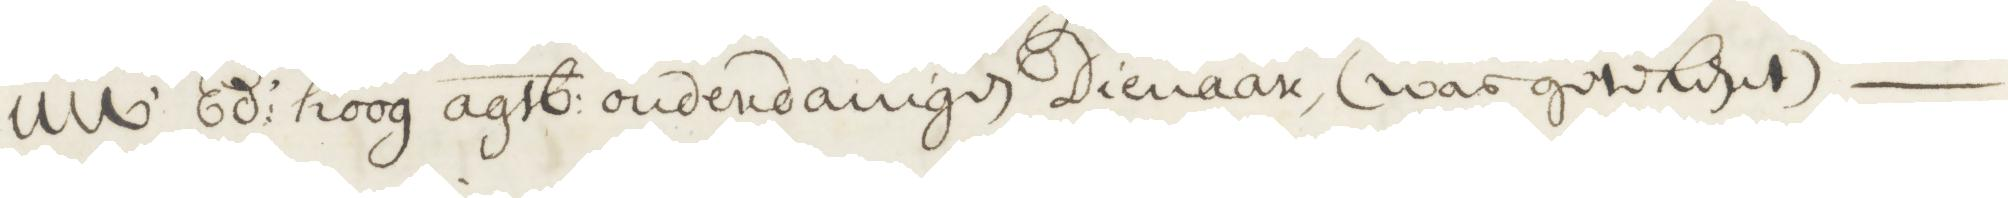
UW Ed': hoog agtb: onderdanigen Dienaar, (was getekent) —
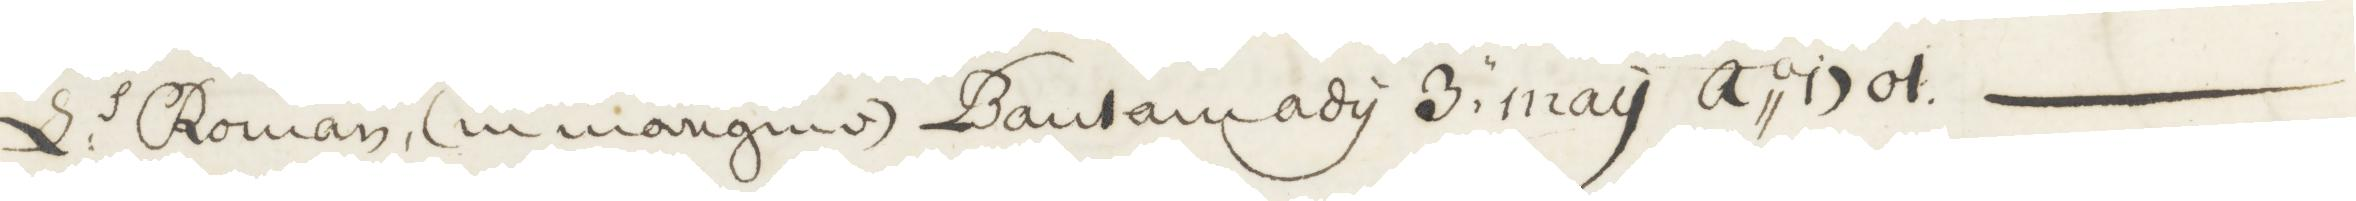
z:s Roman, (in margine) Bantam adij 3:n maij A„o 1701. —
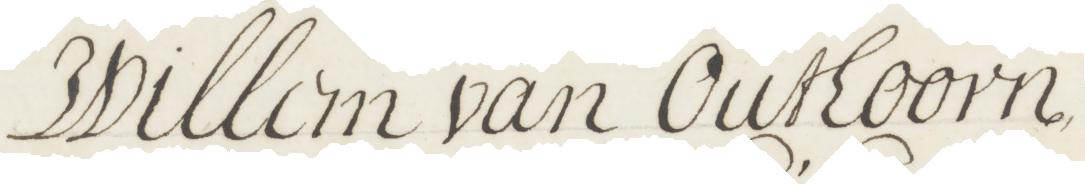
Willem van Outhoorn,
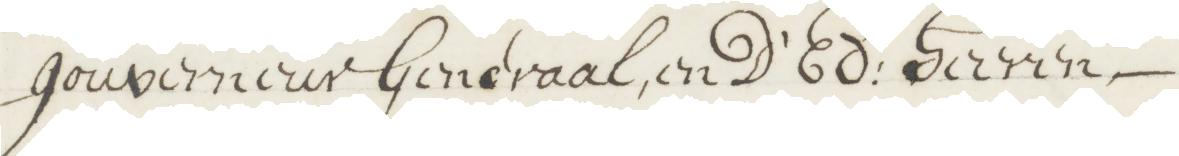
gouverneur Generaal, en D’ Ed': heeren,—
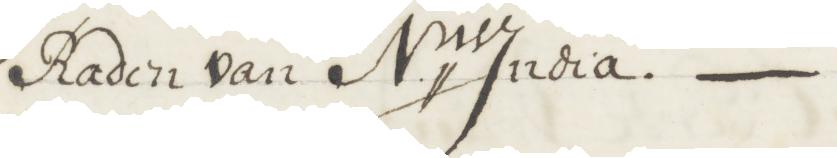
Raden van N„w Jndia. —
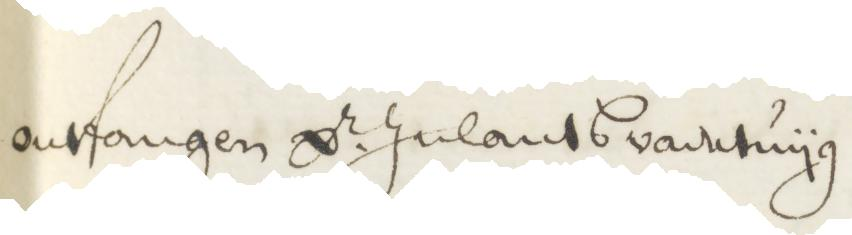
ontfangen p„r Jnlants vaertuijg
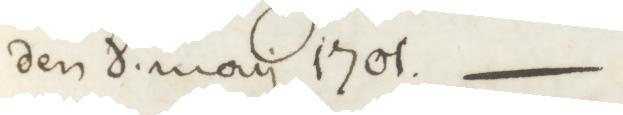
den 8.n maij 1701. —
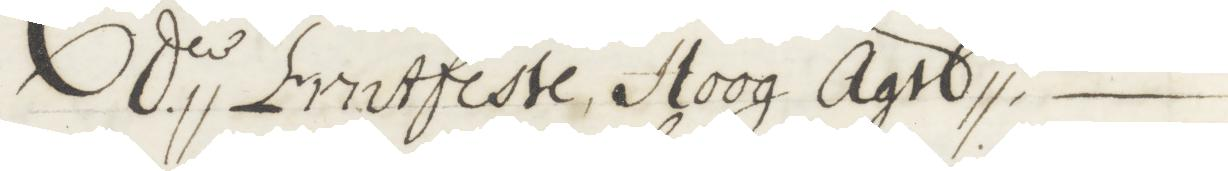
Ed„le Erntfeste, Hoog Agtb„, —
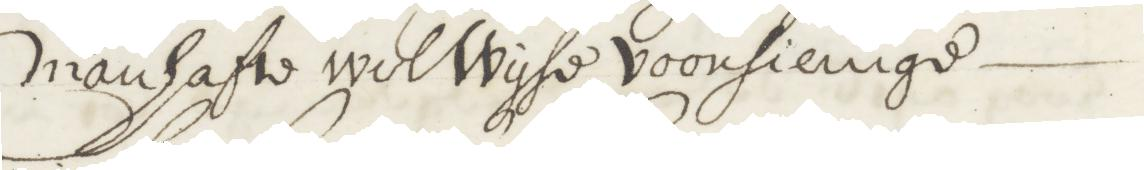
manhafte wel Wijse voorsienige —
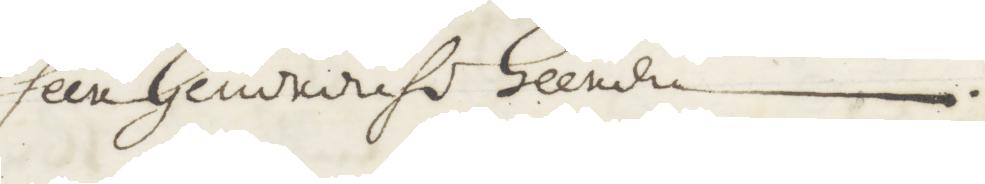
seer Genereuse heeren.
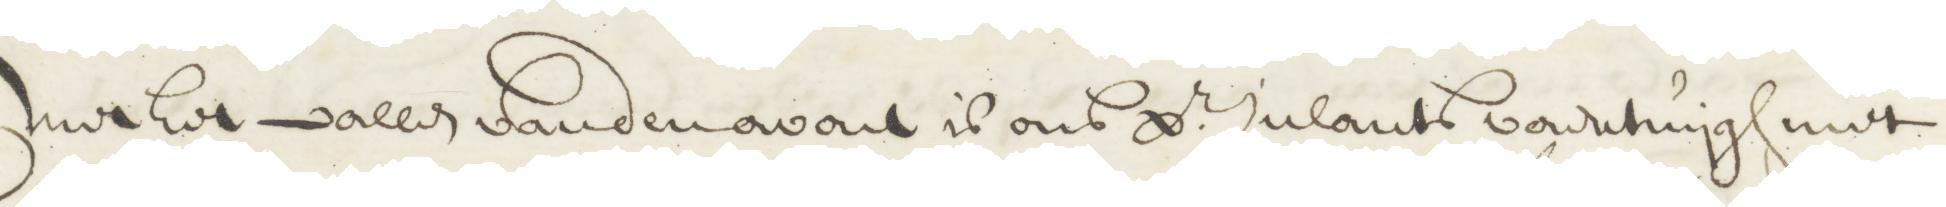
met het vallen van den avont is ons p.r Jnlants vaertuijgh met
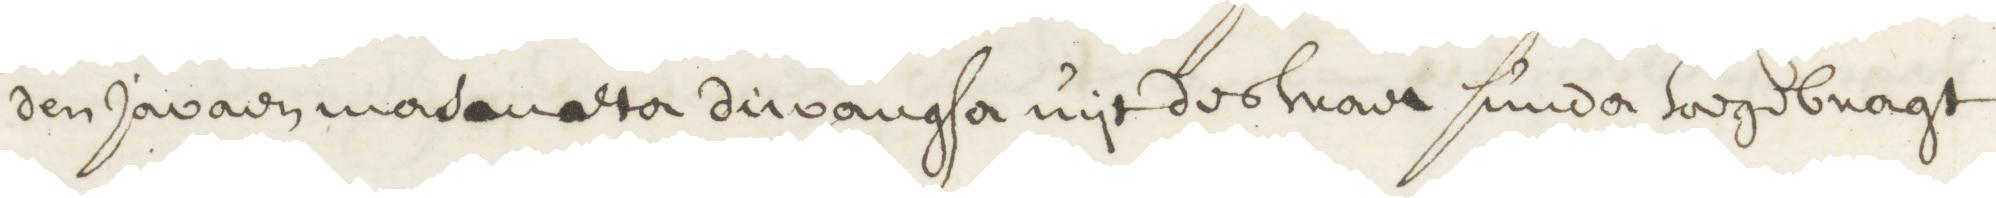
den Javaen masaneta diwangsa uijt destraet sunda toegebragt
